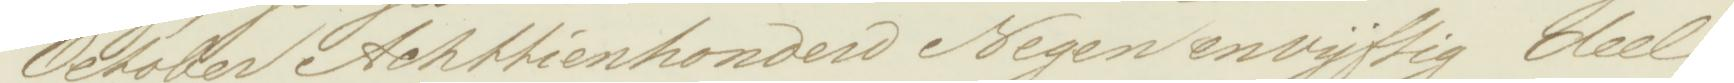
October Achttienhonderd Negen envijftig deel
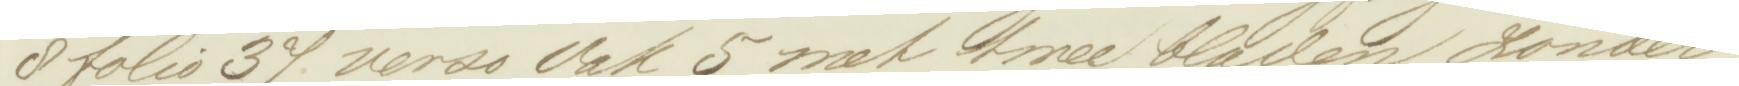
8 folio 37 verso vak 5 met twee bladen zonder
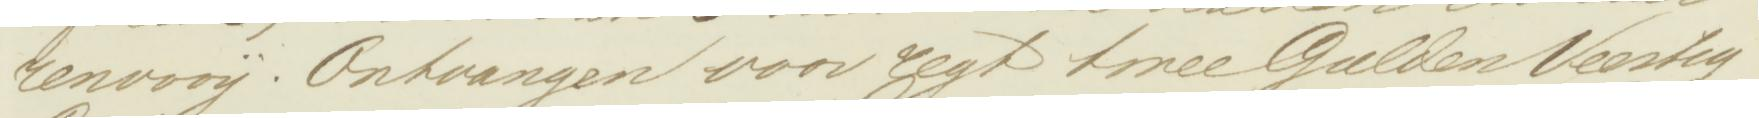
renvooij. Ontvangen voor regt twee Gulden Veertig
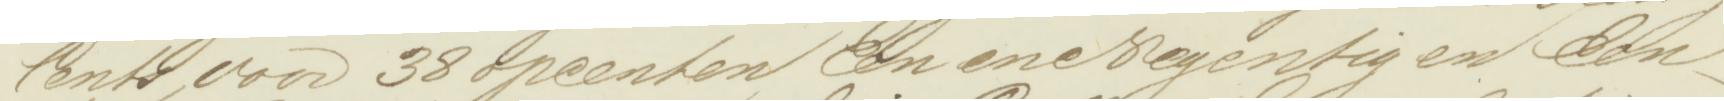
Cents, voor 38 opcenten Een enNegentig en Een
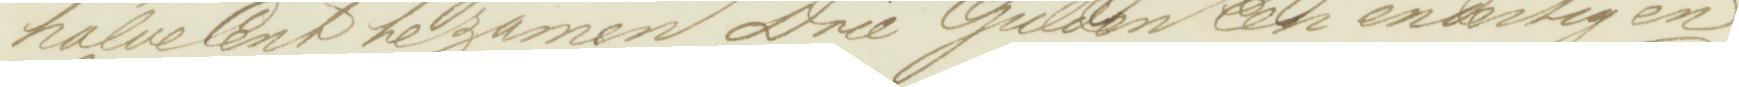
halve Cent te zamen Drie Gulden Een endertig en
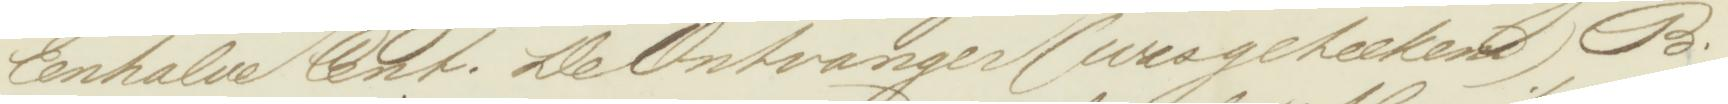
Een halve Cent. De Ontvanger (was geteekend) B.
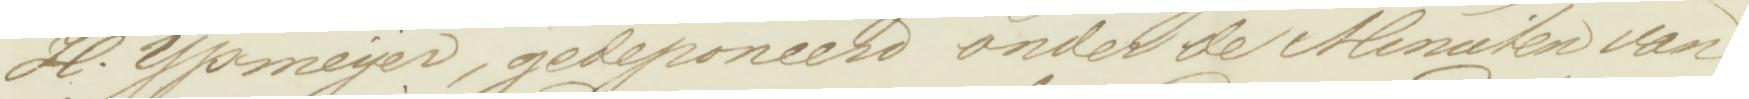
H. Ypmeijer, gedeponeerd onder de Minuten van
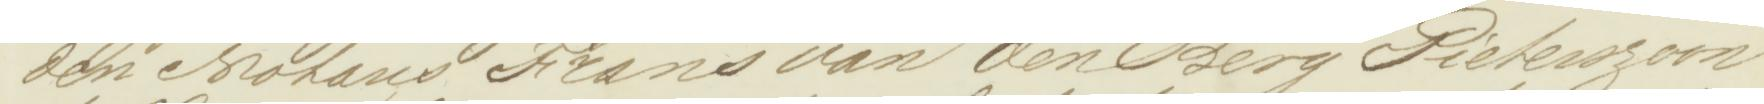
den Notaris Frans van den Berg Pieterszoon
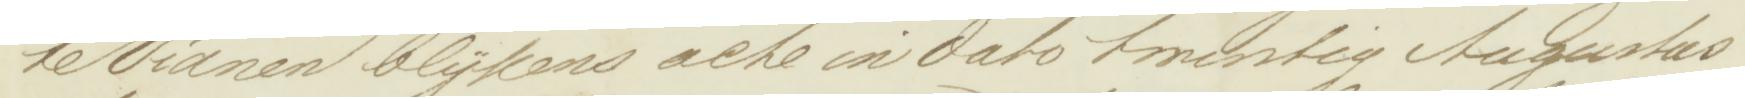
te Vianen blijkens acte in dato twintig Augustus
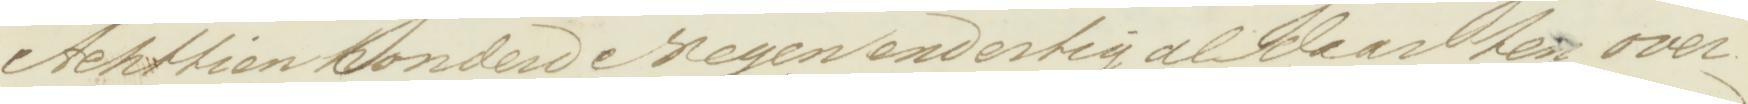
Achttien honderd Negen endertig al daar ten over„
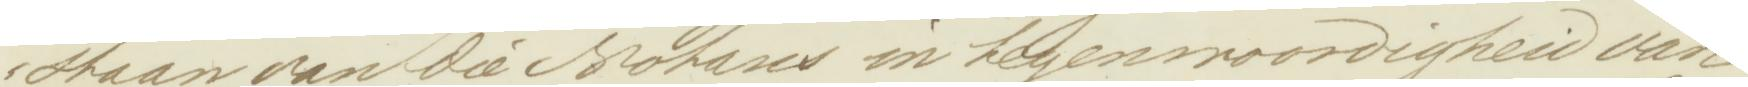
„staan van die Notaris in tegenwoordigheid van
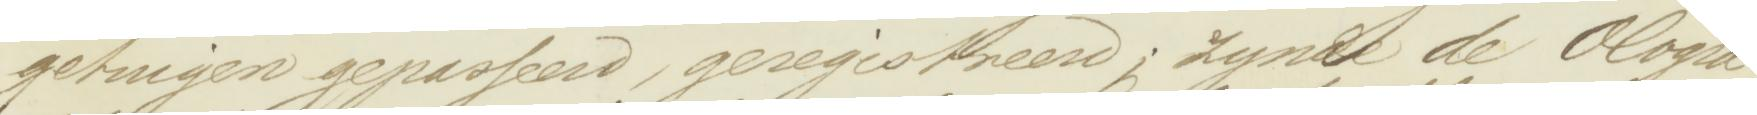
getuigen gepasseerd, geregistreerd: zijnde de Ologra
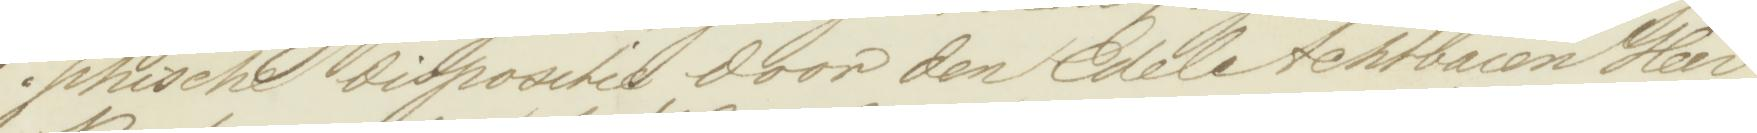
„phische dispositie door den Edele Achtbaren Heer
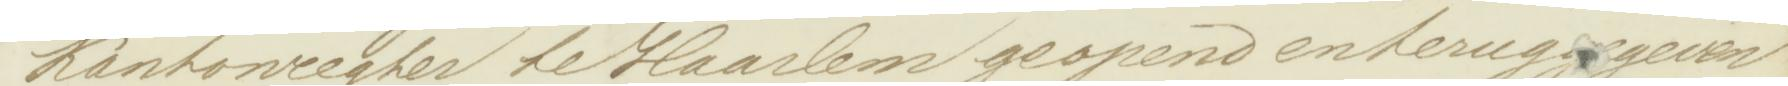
Kantonregter teHaarlem geopend enterug gegeven
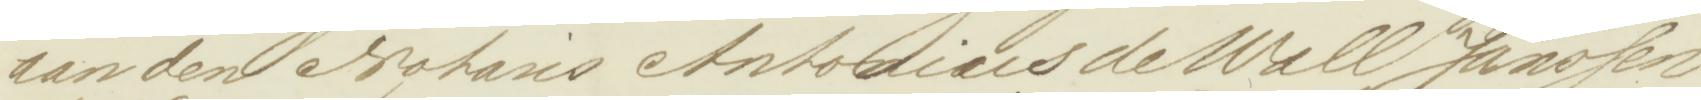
aan den Notaris Antonicus de Wall Janssen
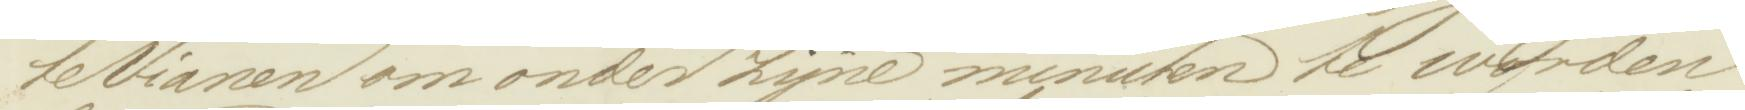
teVianen om onder zijne minuten te worden
